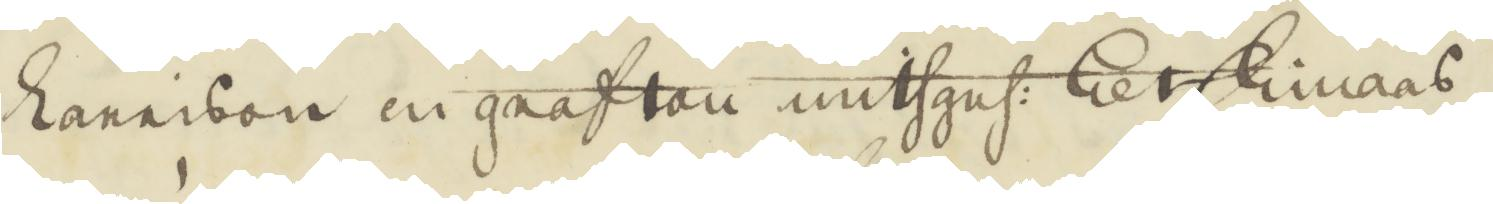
harrison en grafton mitsgrs: het Chinaas
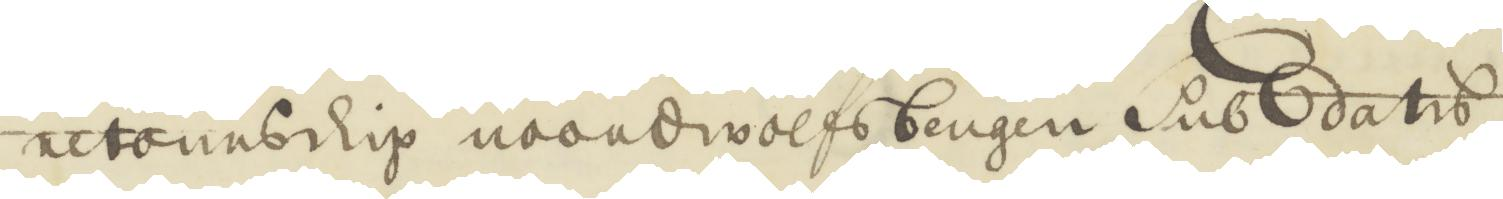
retourschip noordwolfsbergen sub datis
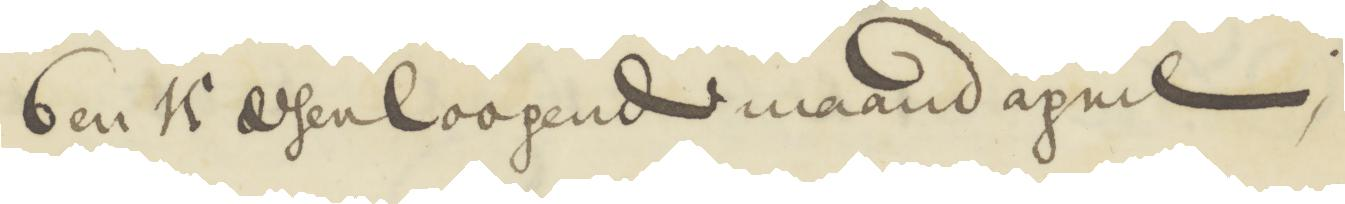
6 en 15 desen loopende maand april;
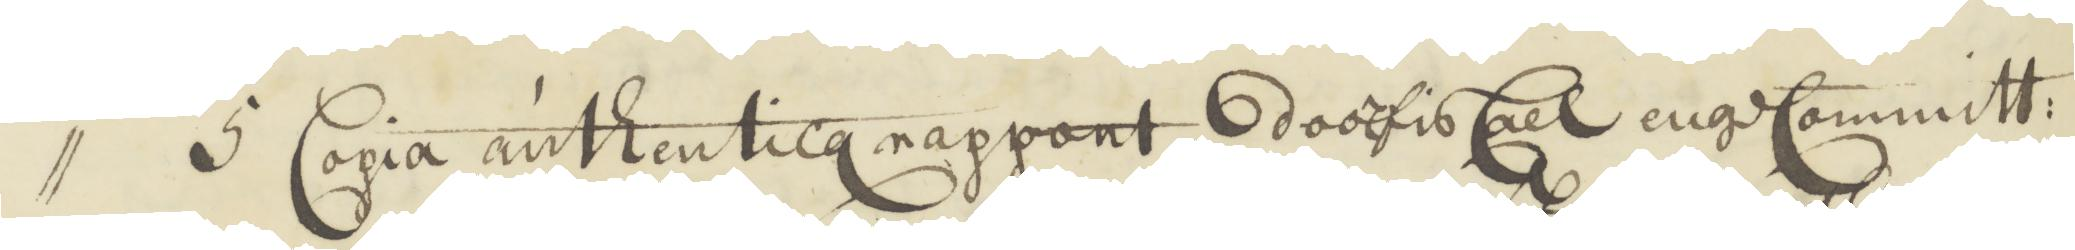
„ 5 Copia authenticq rapport door fiscael en gecommitt:
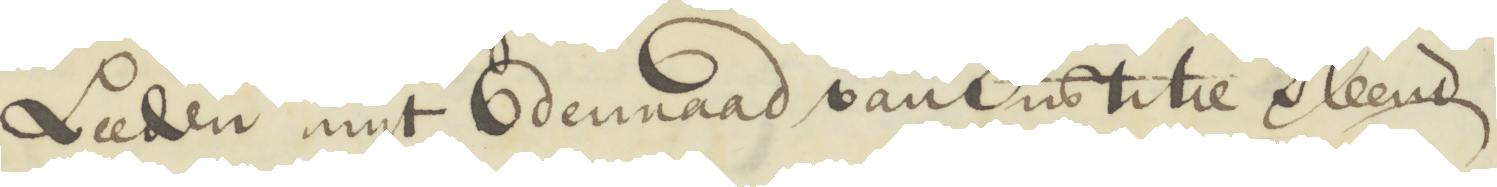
Leeden uijt den raad van Iustitie verleend
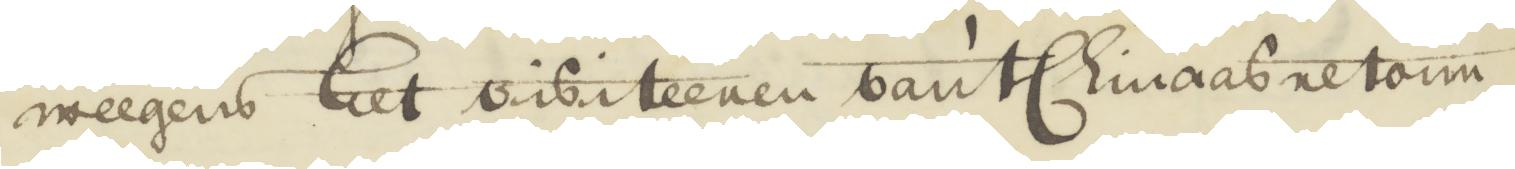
weegens het visiteeren van ’t Chinaas retour
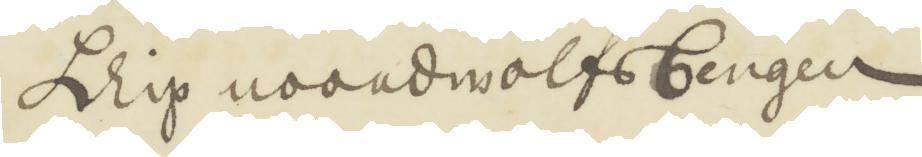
schip noordwolfsbengen
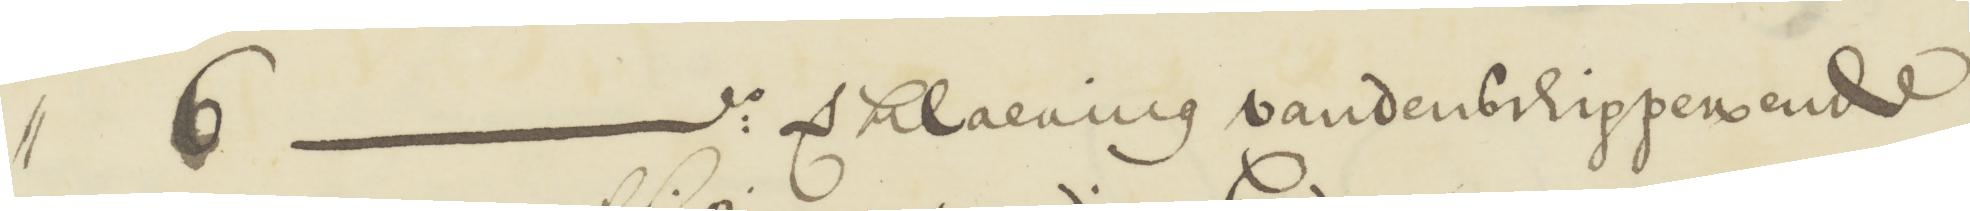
„ 6 _:o verklaering van den schipper ende
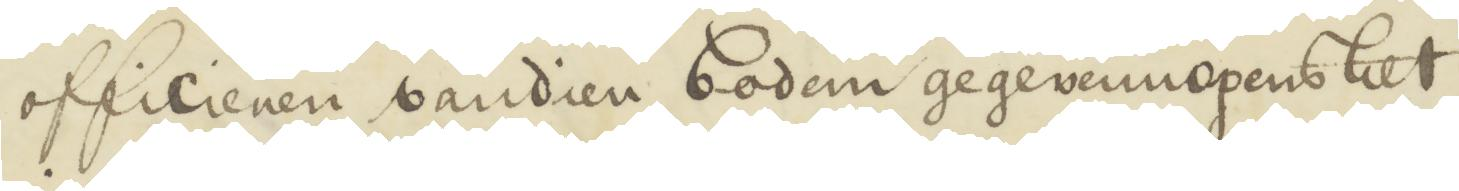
officieren van dien bodem gegeven nopens het
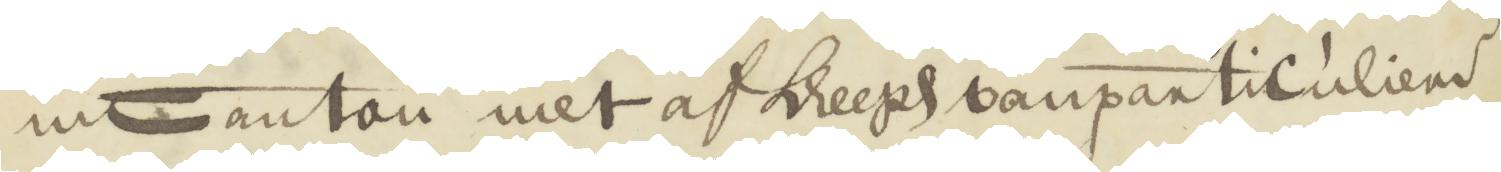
in canton niet afscheepen van particuliere
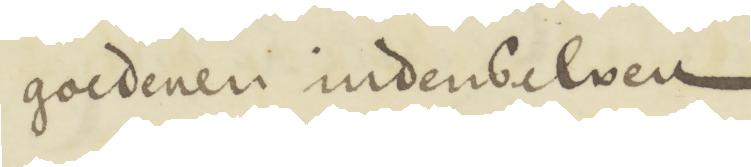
goederen indenselven
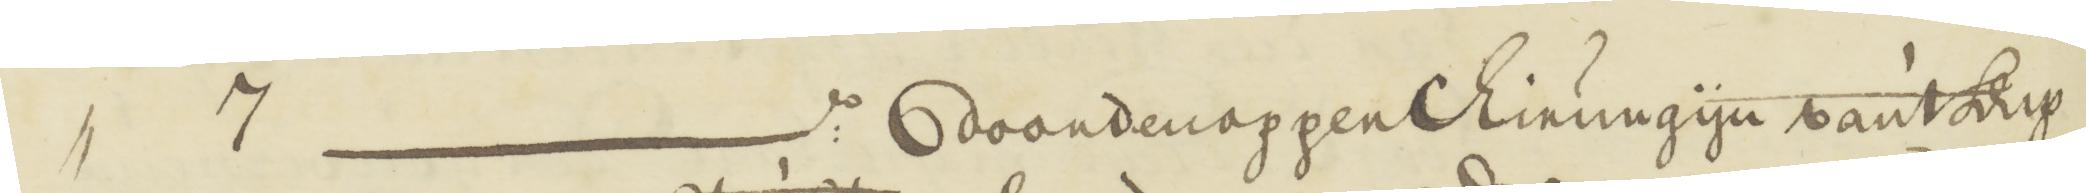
„ 7 _:o door den opper Chirurgijn van ’t schip
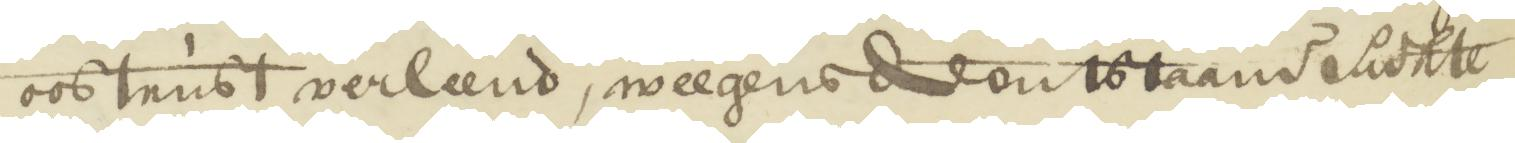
oostrust verleend, weegens de ontstaane siekte
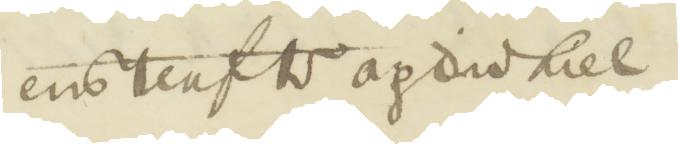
en sterfte op die kiel
